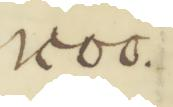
1500.
